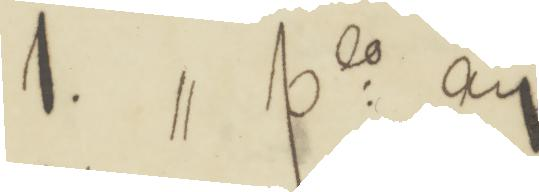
p:lo aij
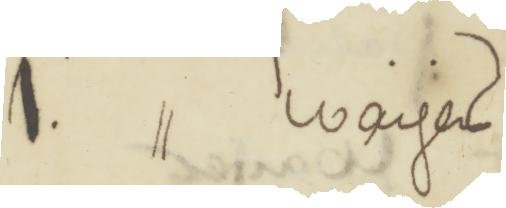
waijer
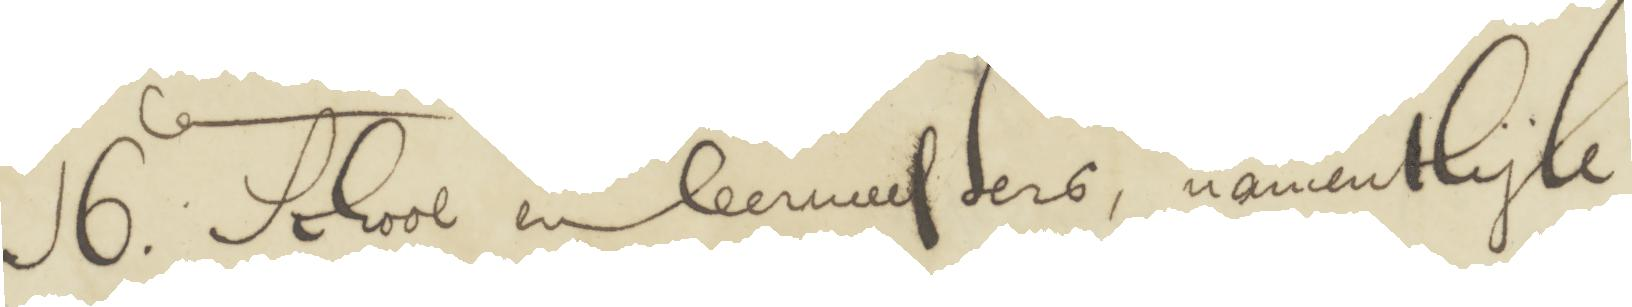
16. School en leermeesters, namentlijk
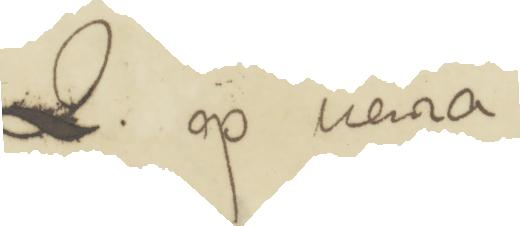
2. op neira
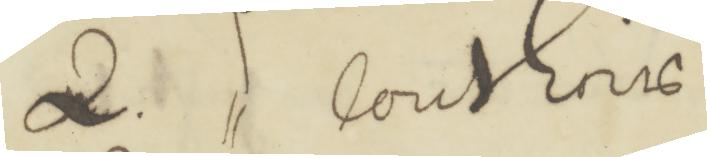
2. „ lonthoir
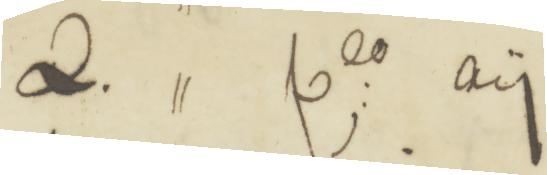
2. „ p:lo aij
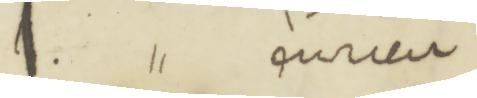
1. „ ourien
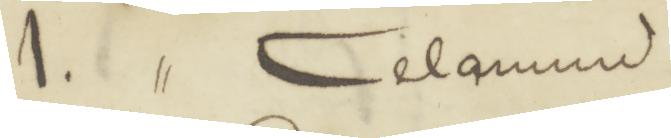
1. „ Celamme
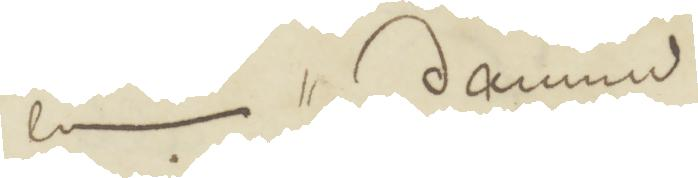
1. „ damme
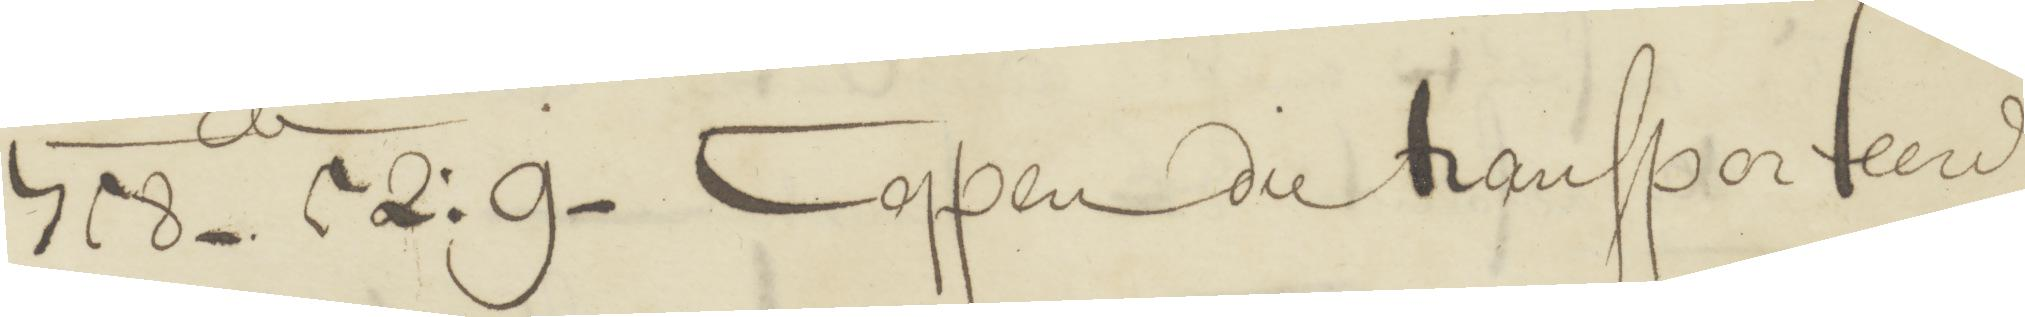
708–. 52: 9– Coppen die transporteere
